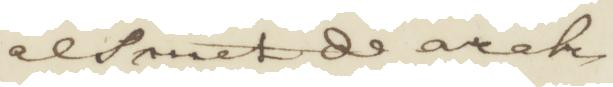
als met de arak
